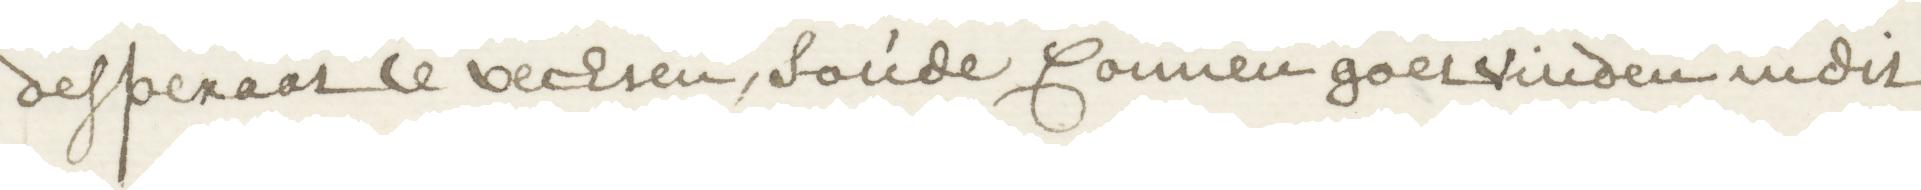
desperaat te vechten, soude Connen goet vinden in dit
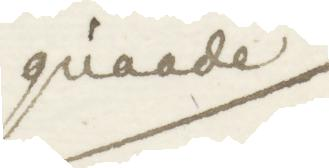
quaade
